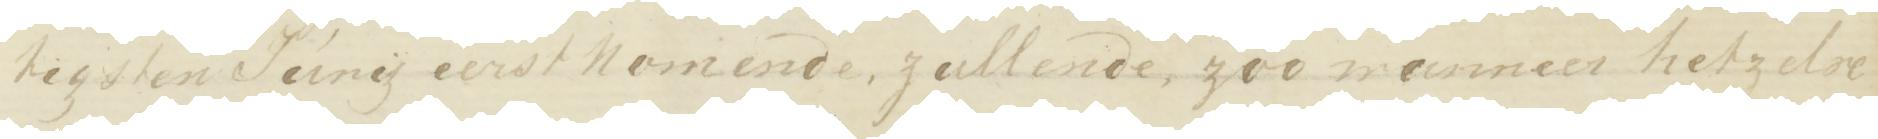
tigsten Iunij eerst komende, zullende zoo wanneer hetzelve
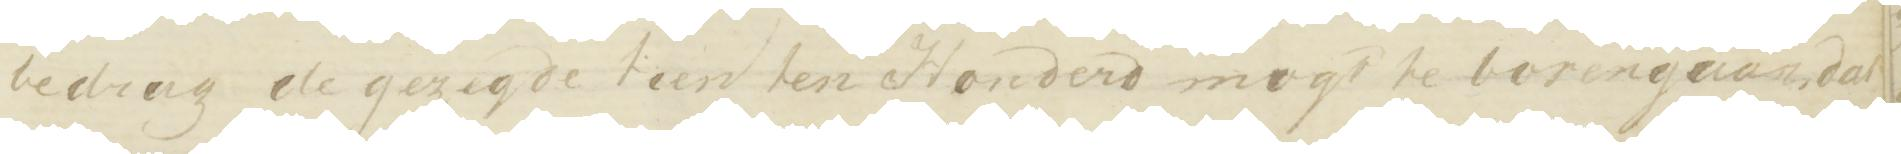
bedrag de gezegde tien ten Honderd mogt te bovengaan, dat
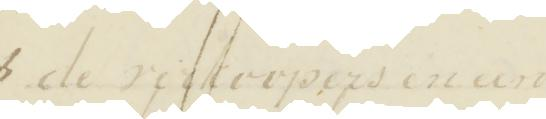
¶de verkoopers en een
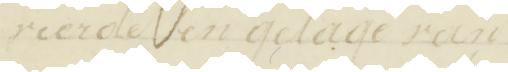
vierde ten gelage van
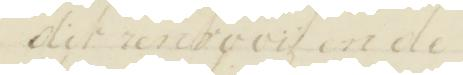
dit renvooij en de
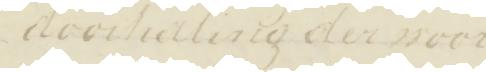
„doorhaling der woor
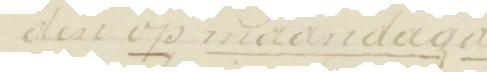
den op maandag de
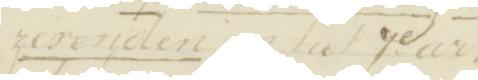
zevenden, in het 7e ar
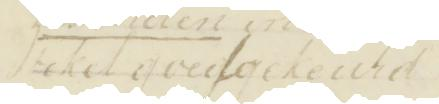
tikel Goedgekeurd
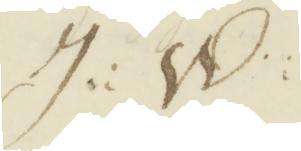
J: W
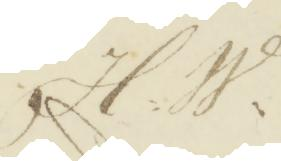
H: W:
